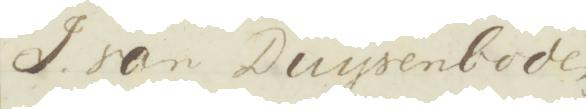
J. van Duyvenboden
